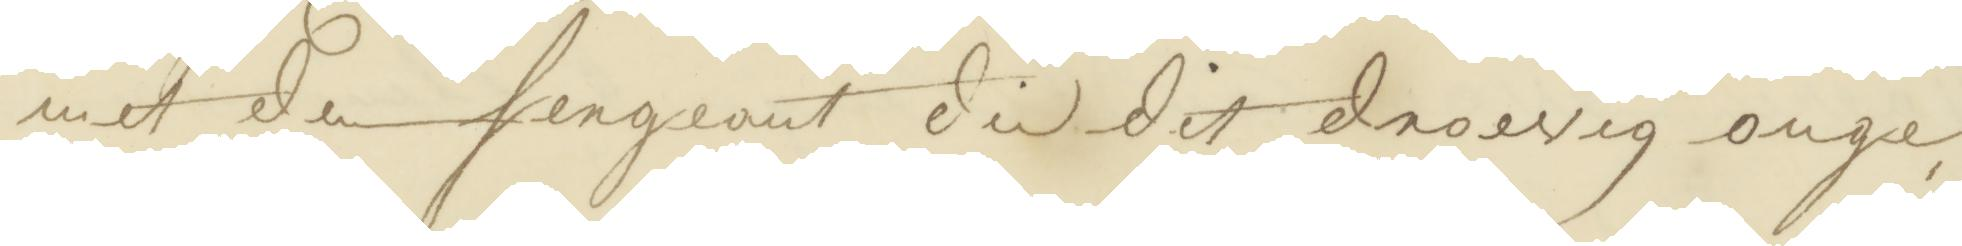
met den sergeant die dit droevig onge,
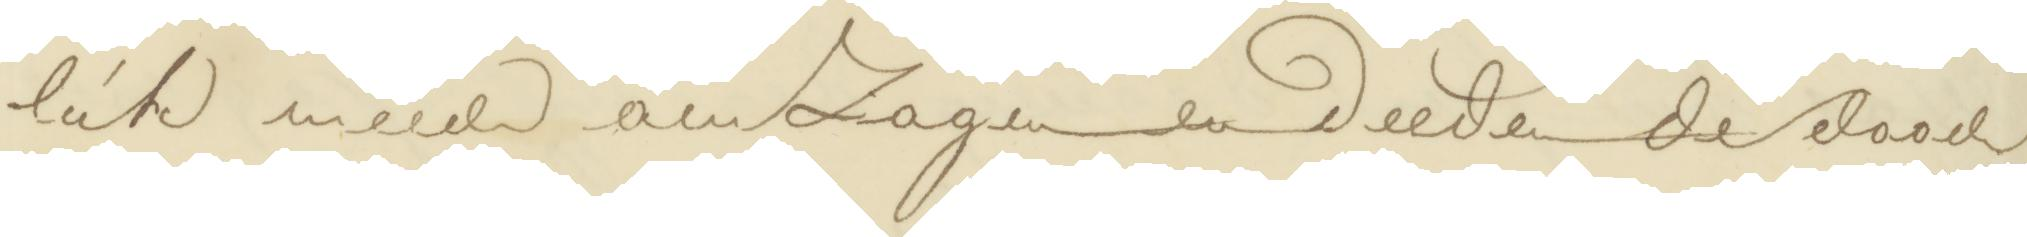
luk meede aen Zagen, en deeden de doode
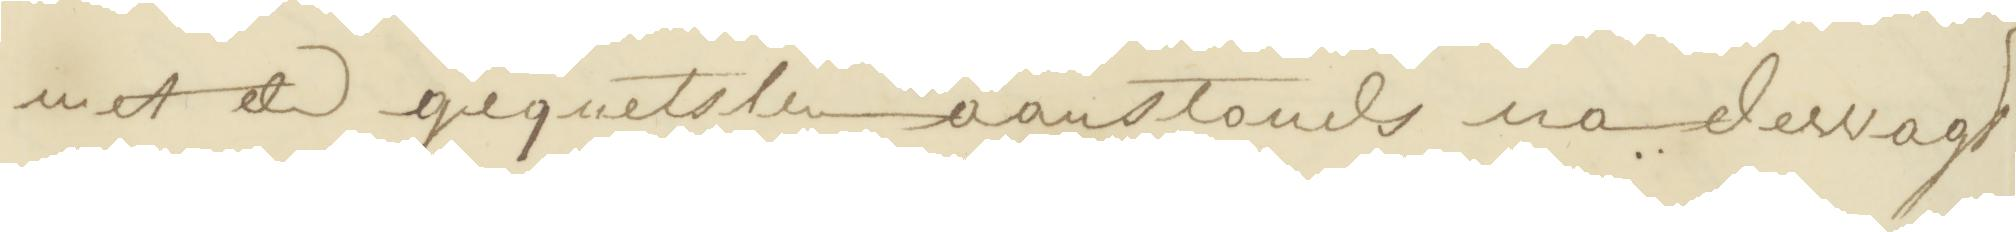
met de gequetsten aanstonds na de wagt
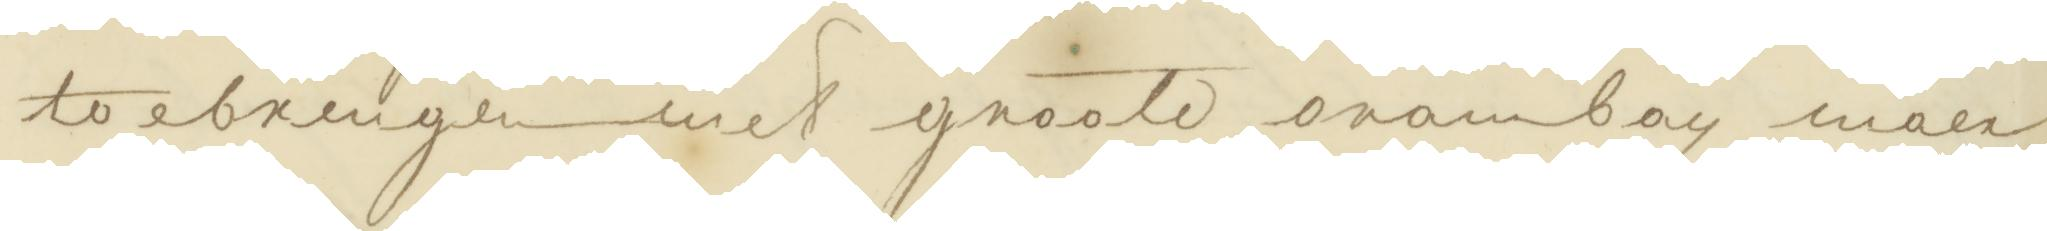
toebrengen met groote orambaij maer
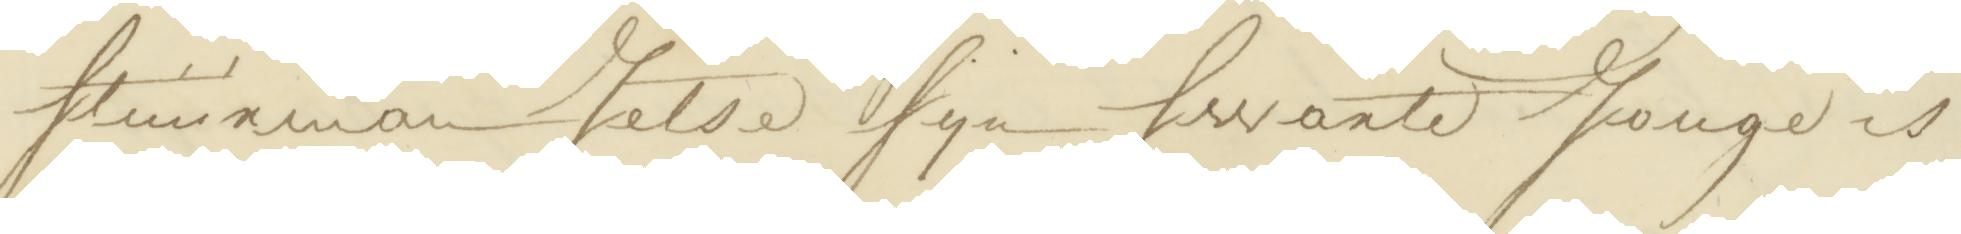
stuurman Jetse sijn swarte Jonge is
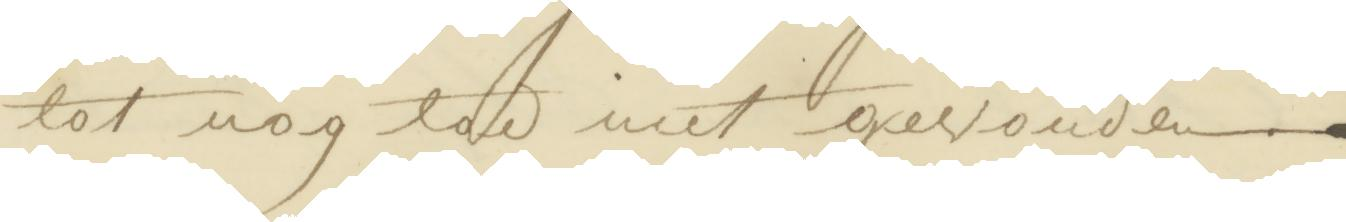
tot nog toe niet gevonden
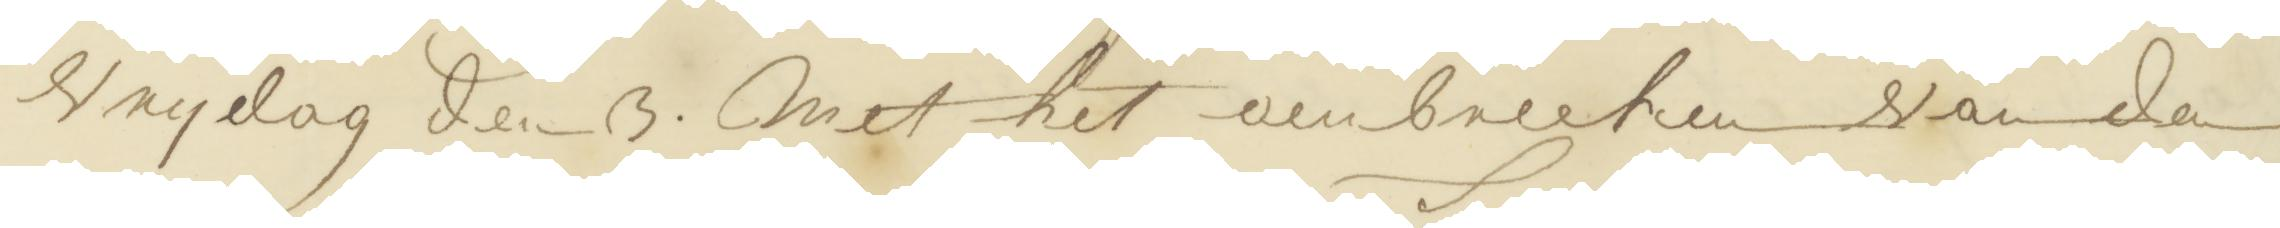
Vrijdag den 3. met het aenbreeken van den
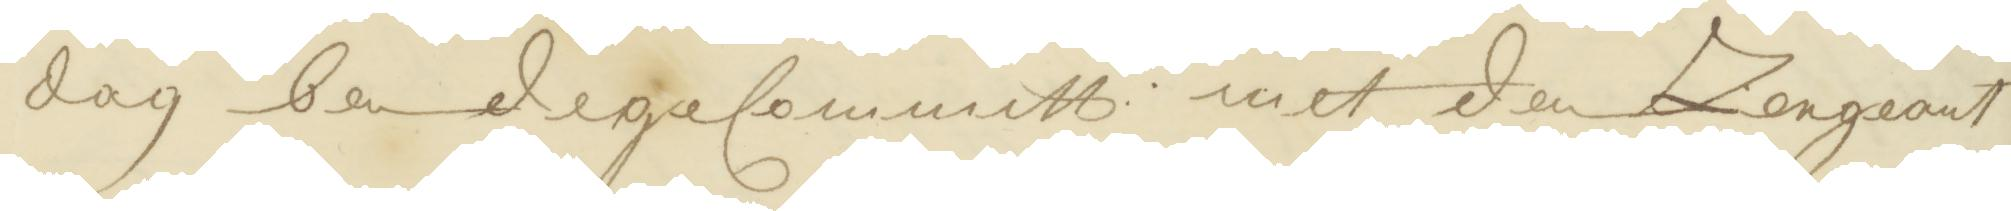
dag ben de gecommitt:s met den Zergeant
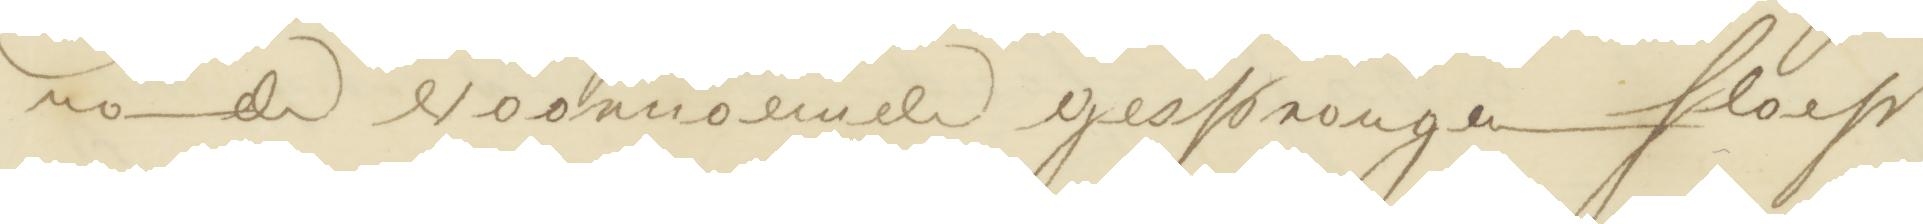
na de voornoemde gesprongen sloep
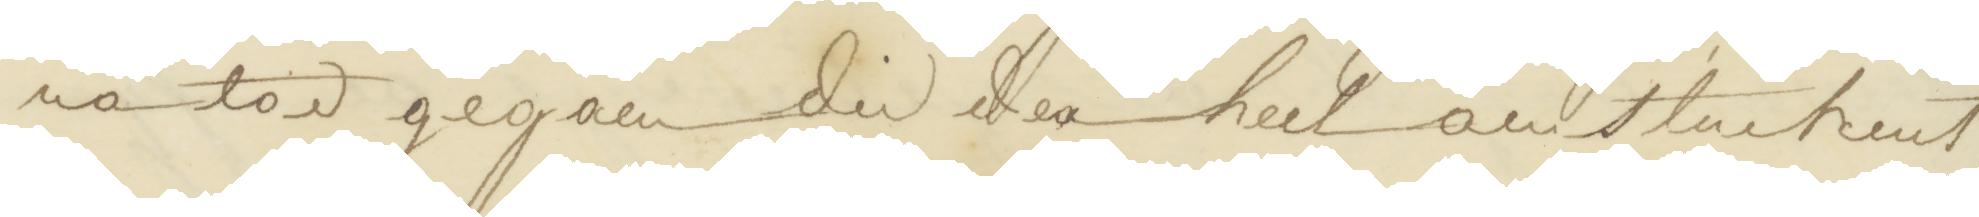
na toe gegaen die der heel aen stuckent
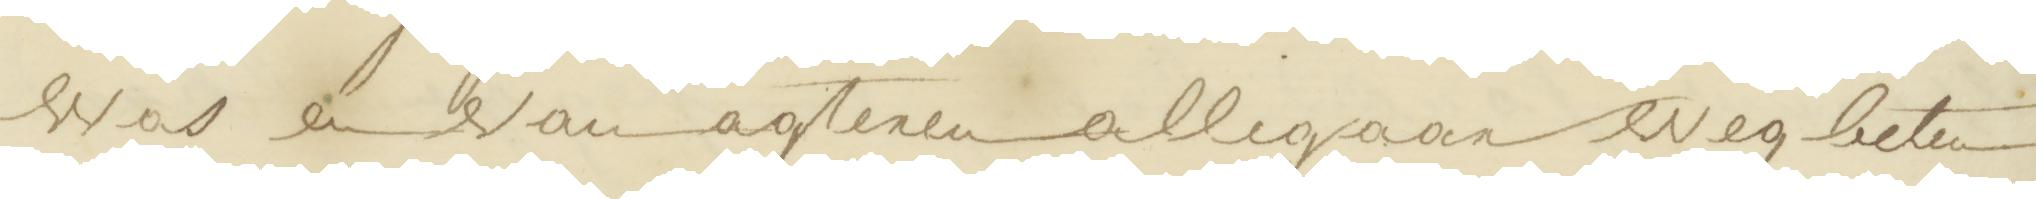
was en van agteren alligaar wegbeten
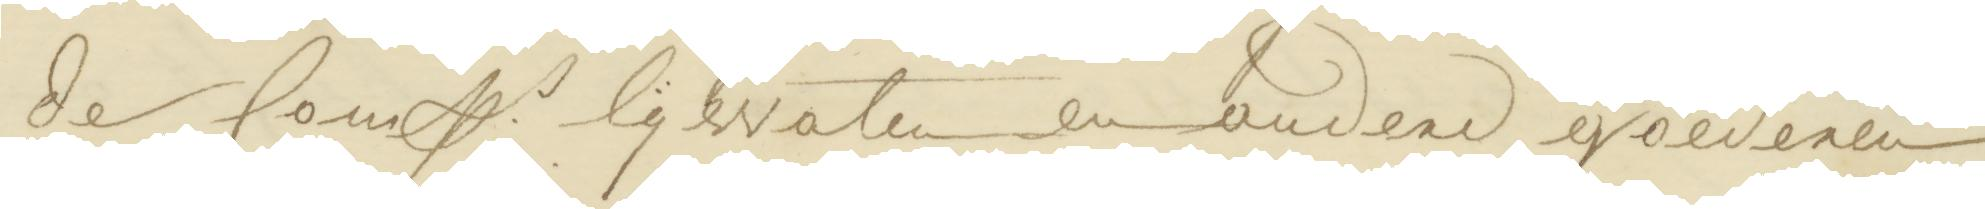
de Comp.t lijwaten en andere goederen
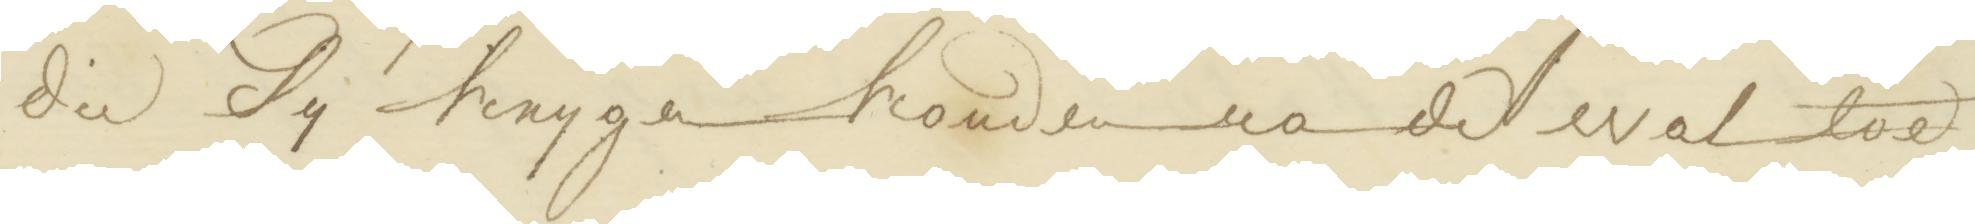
die Sy krijgen konden na de wal toe
